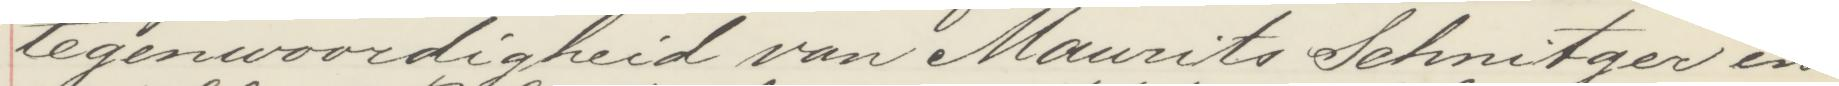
tegenwoordigheid van Maurits Schnitger en
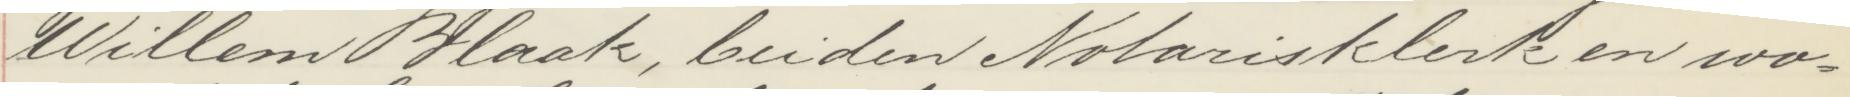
Willem Blaak, beiden Notarisklerk en wo=
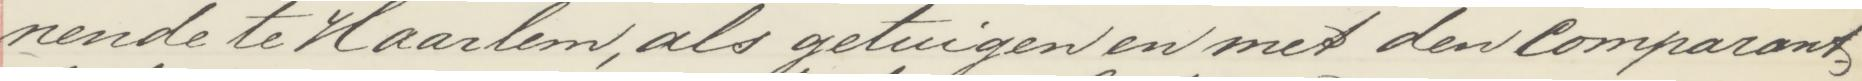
nende te Haarlem, als getuigen en met den Comparant-
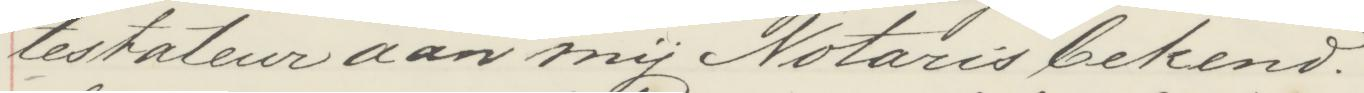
testateur aan mij Notaris bekend.
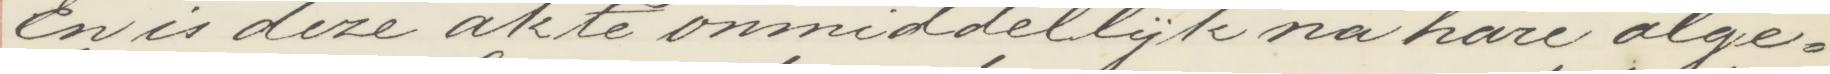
En is deze akte onmiddellijk na hare alge=
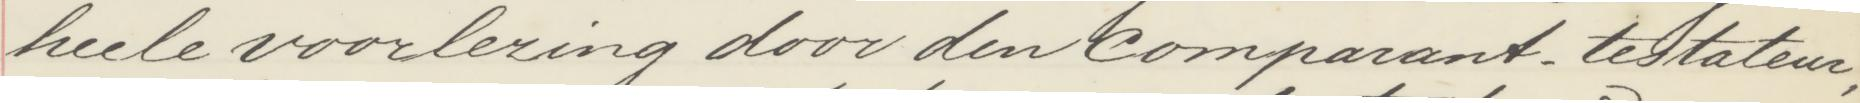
heele voorlezing door den Comparant- testateur,
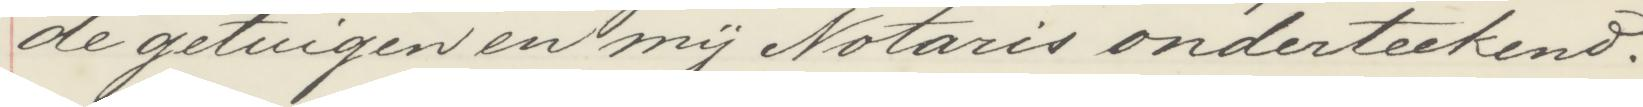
de getuigen en mij Notaris onderteekend.
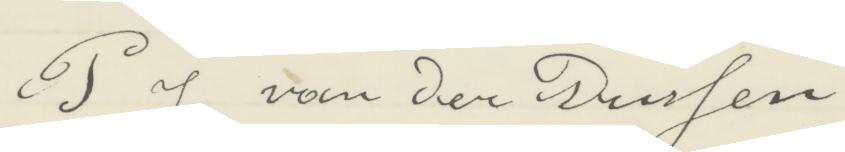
P J van der Dussen
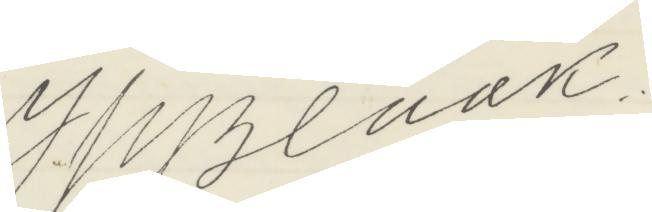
J .WBlaak.
